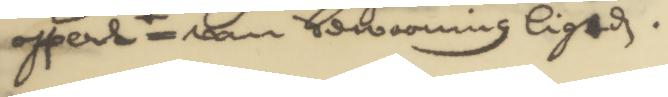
opperh=t van dewooning ligten.
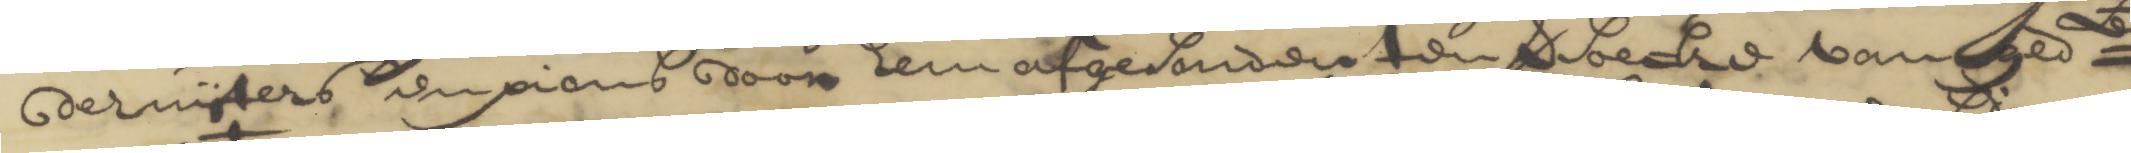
deruijters en pions door hem afgesonden ten versoecke van ged=te
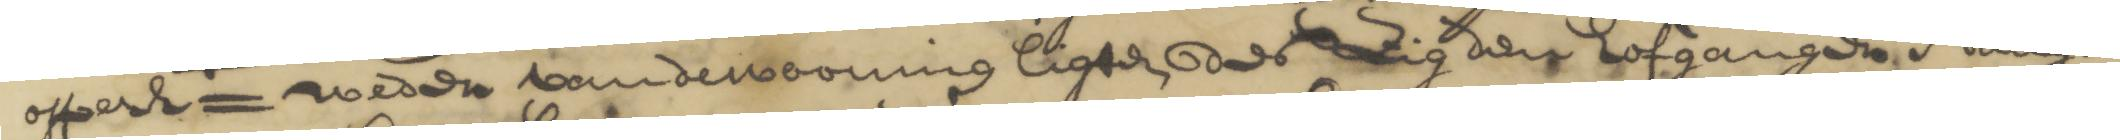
opperh=t weder van de wooning ligten des zig den hofganger s'daags
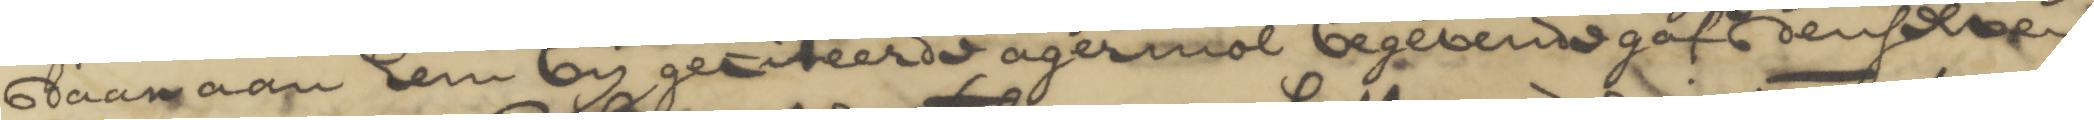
daar aan hem bij geciteerde agermol begevende gaf denselven
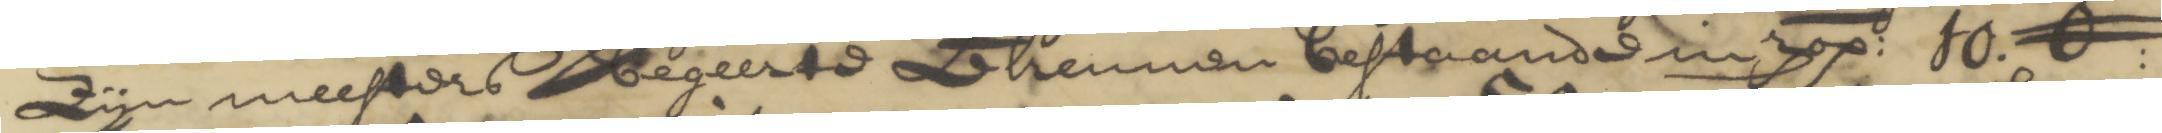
zijn meesters begeerte te kennen bestaande in rop:s 10. Ø:
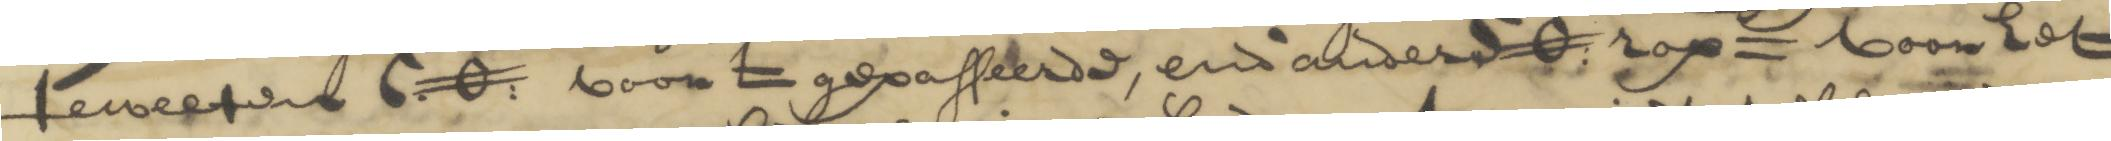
teweeten 5. Ø. voor ’t gepasseerde, en ander 5 Ø: rop=s voor het
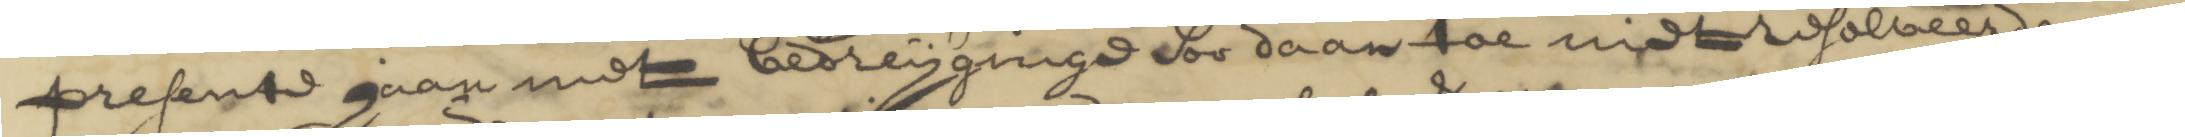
presente jaar met bedreijginge soo daar toe niet resolveerden
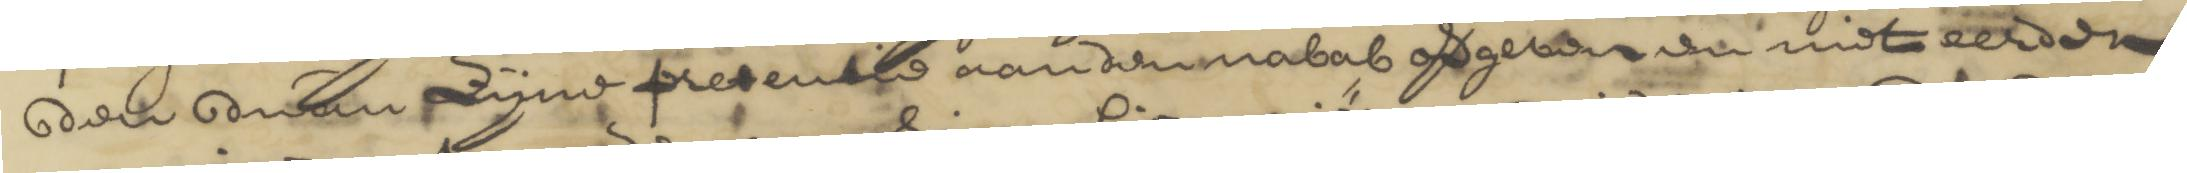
den duan zijne pretentie aan den nabab overgeven en niet eerder
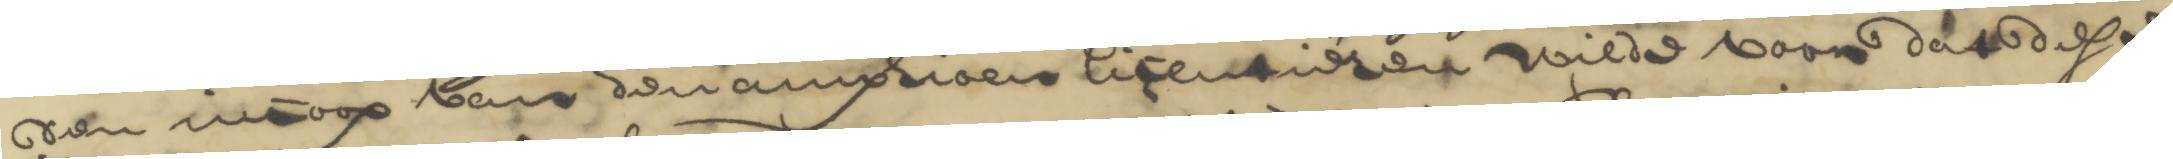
den incoop van den amphioen licentiëren wilde voor dat dese
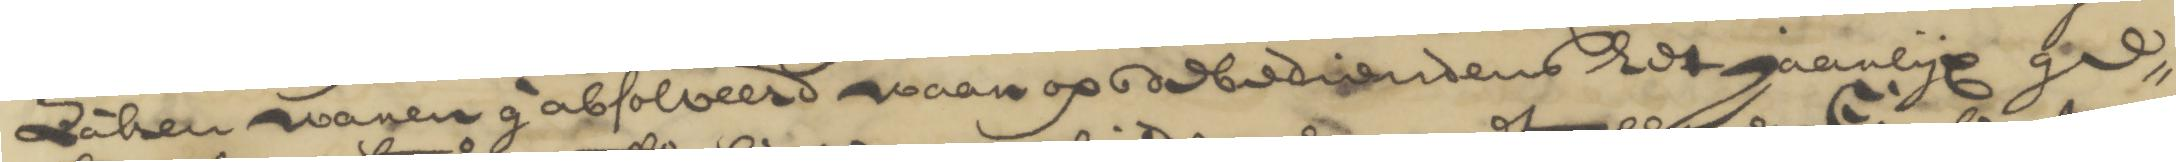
zaken waren g’absolveerd waar op de bediendens het jaarlijx ge„
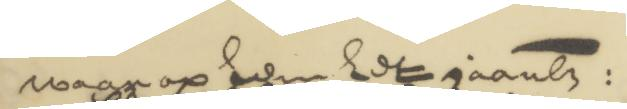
waar op hem het jaarlijk
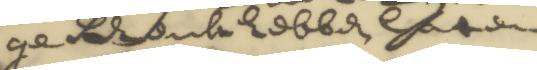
geschenk hebben laten
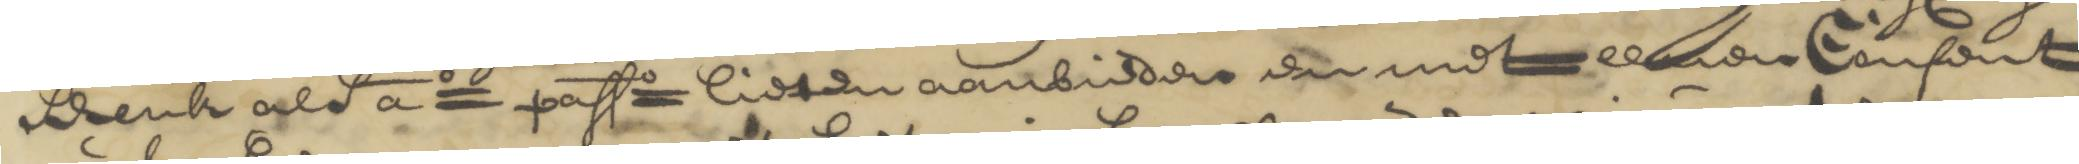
schenk als a=o pass=o lieten aanbieden en met eenen Consent
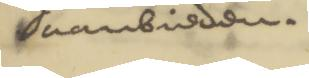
aanbieden.
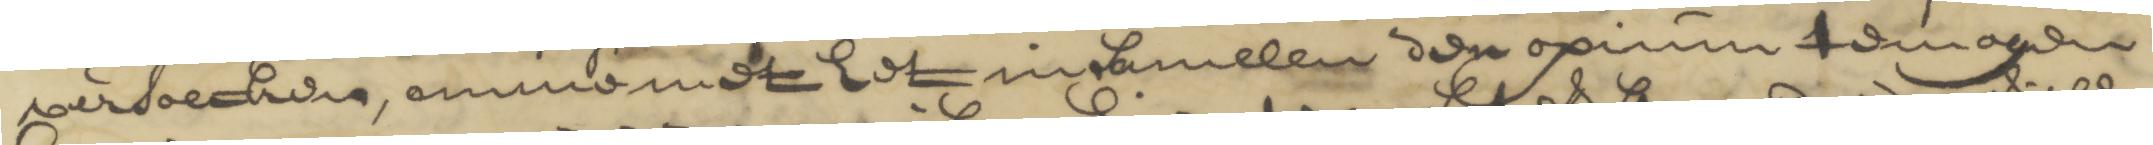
versoecken, omme met het insamelen der opium te mogen
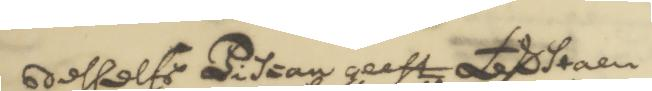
desselfs Piscan geeft te verstaen
